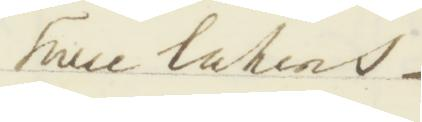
Twee lakens
